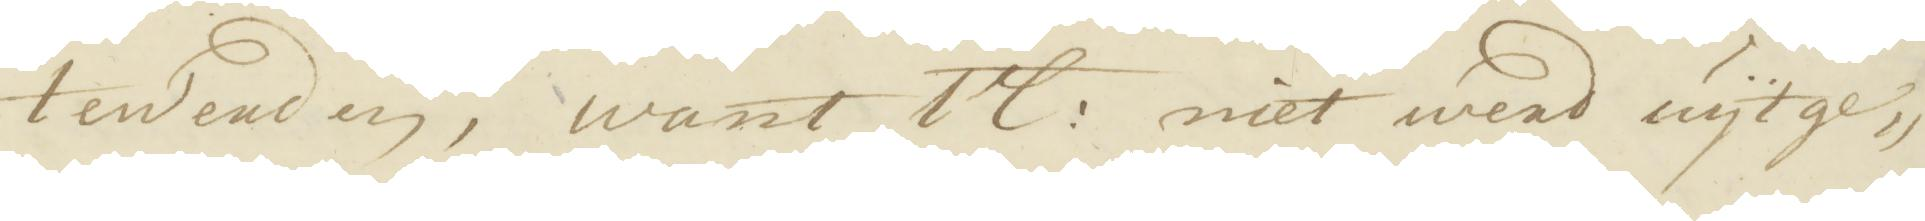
te werden, want VL: niet werd uijtge„
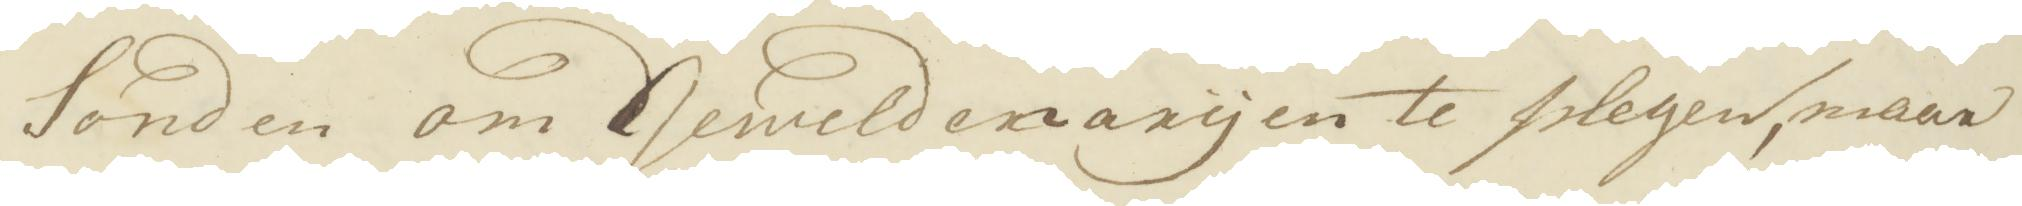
sonden om geweldenarijen te plegen, maar
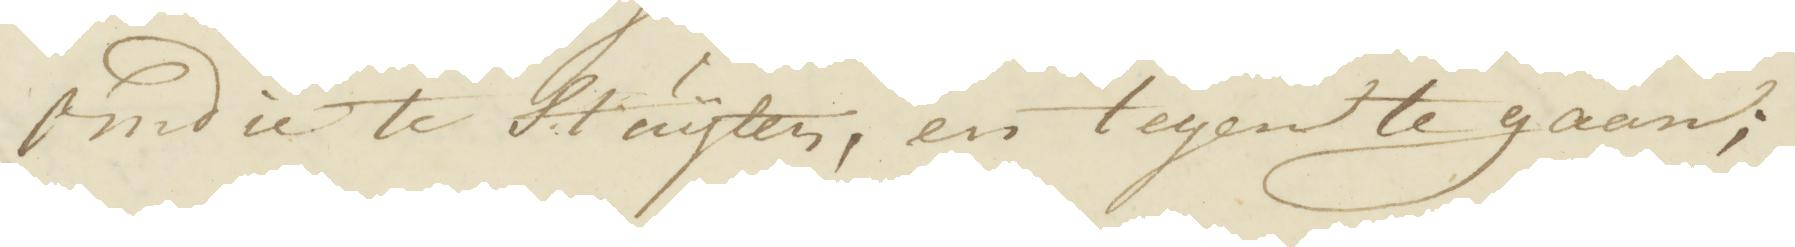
om die te stuijten, en tegen te gaan;
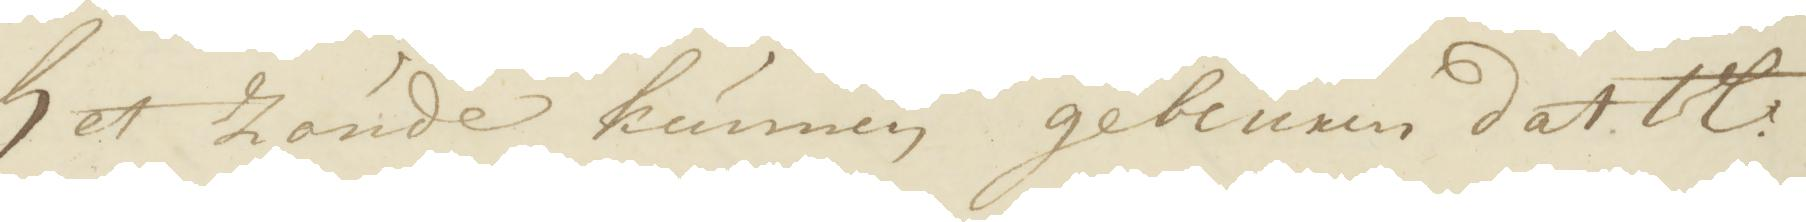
Het zoude kunnen gebeuren dat VL:
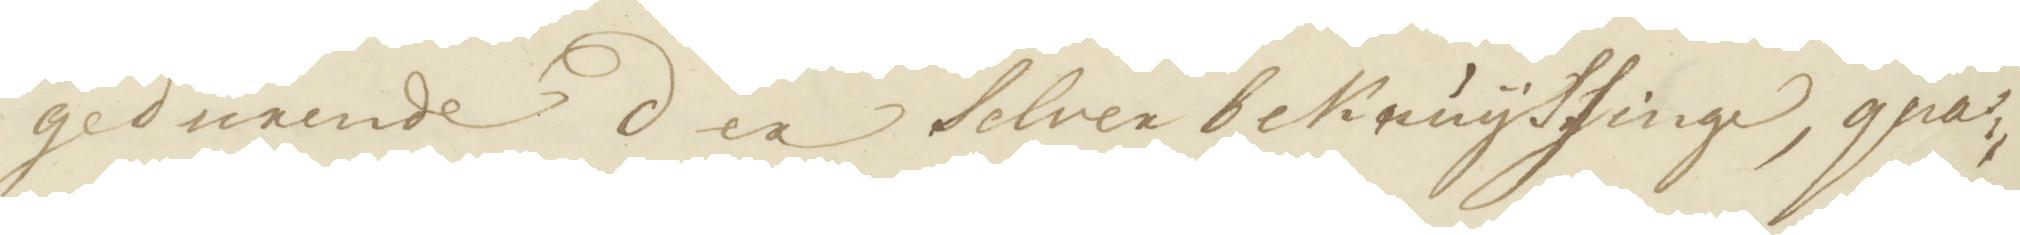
gedurende der selver bekruijssinge, qua„
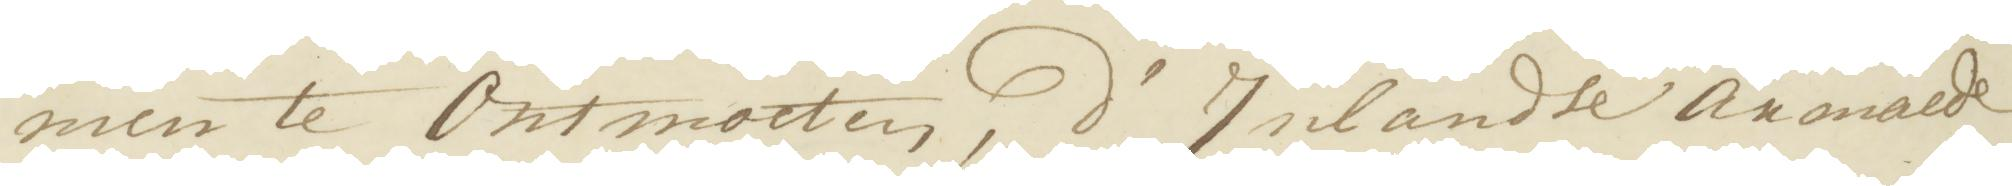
men te ontmoeten, d’ Jnlandse armaede
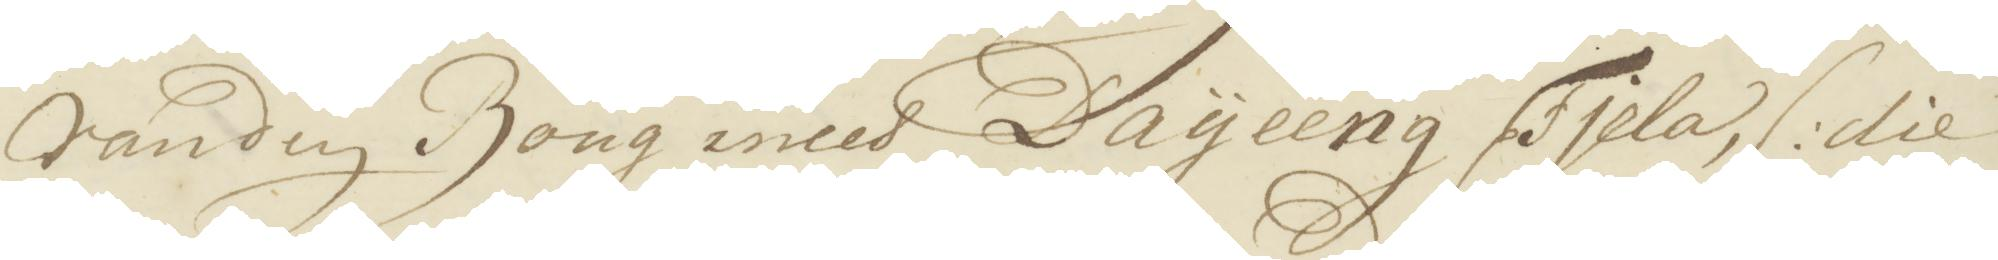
van den Bouginees Daijeeng Tjela, (:die
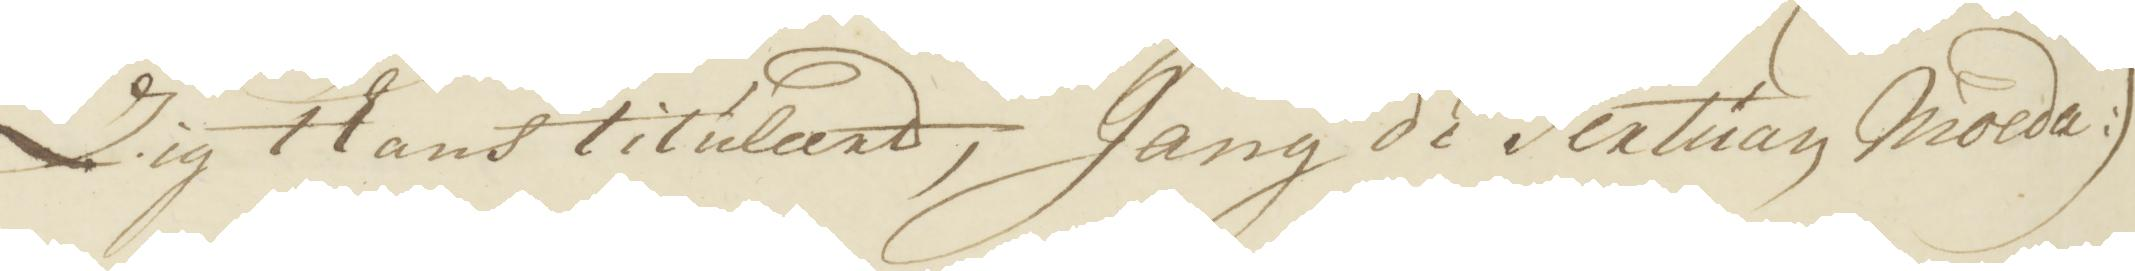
zig thans tituleerd, Jang di Pertuan moeda :)
